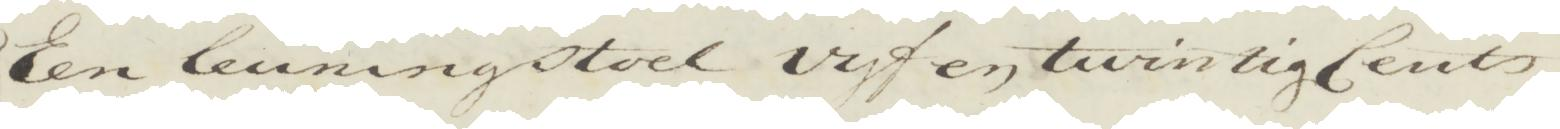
Een leuningstoel vyf en twintig Cents
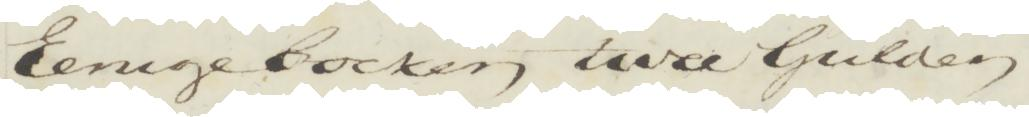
Eenige boeken twee Gulden
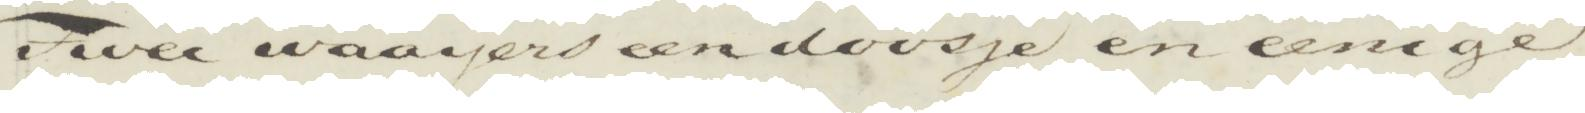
Twee waayers een doosje en eenige
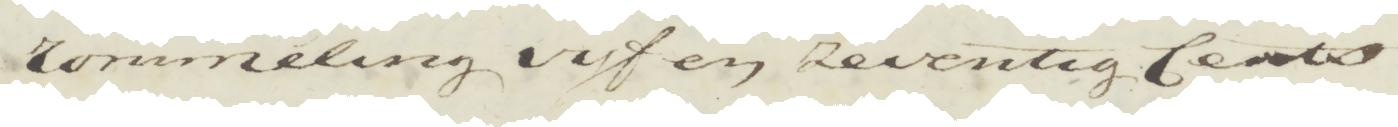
rommeling vyf en zeventig Cents
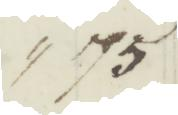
„75
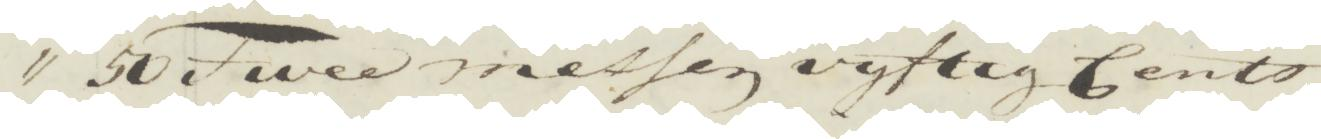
„ 50 Twee messen vyftig Cents
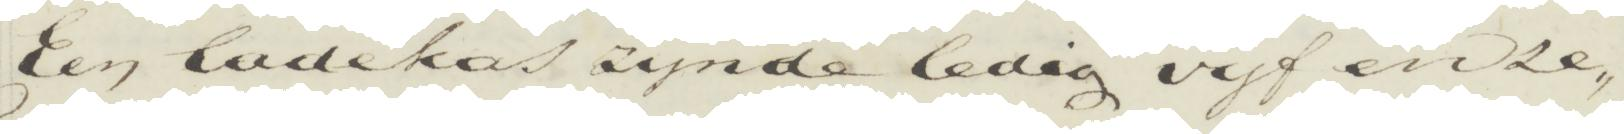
Een ladekas zynde leden vyf en ze„
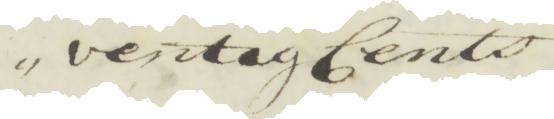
„ventig Cents
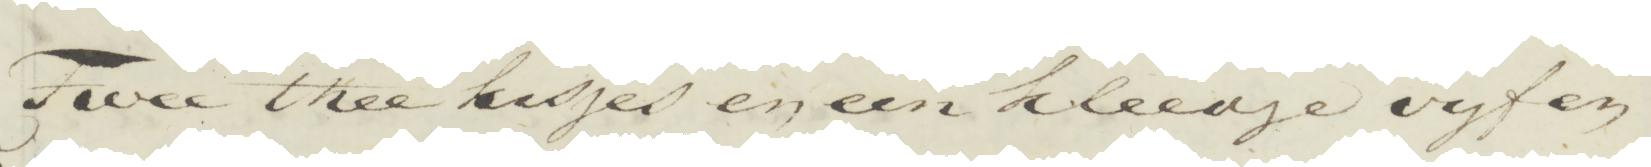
Twee thee kisjes en een kleedje vyf en
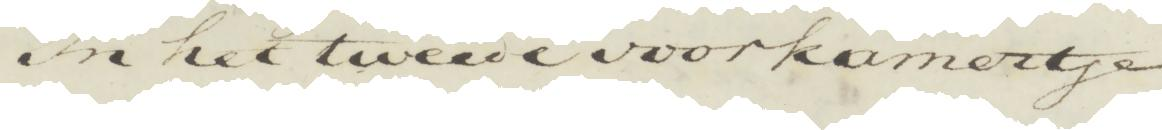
In het tweede voorkamertje
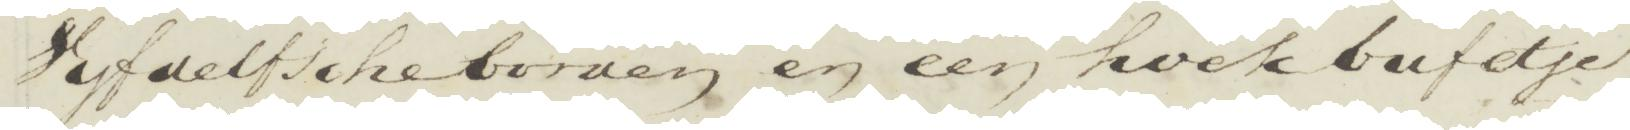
Vyf delfsche borden en een hoekbufetje
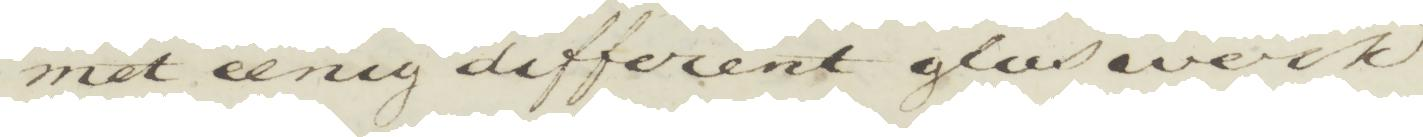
met eenig different glas werk
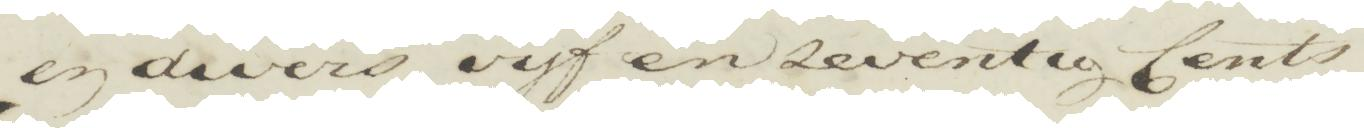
en divers vyf en zeventig Cents
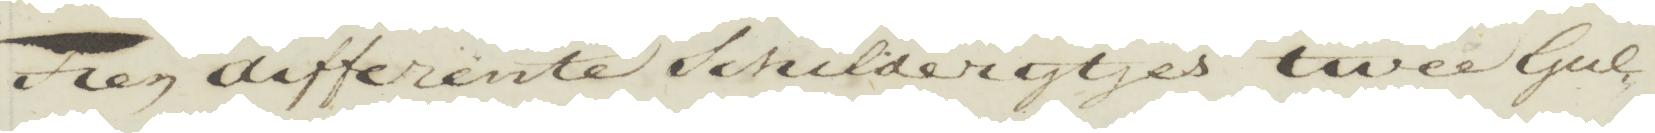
Tien differente schilderytjes twee Gul„
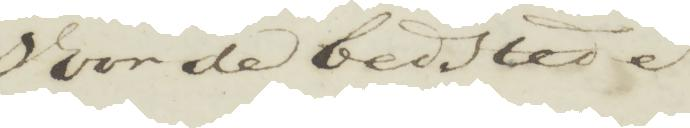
Voor de bedstede
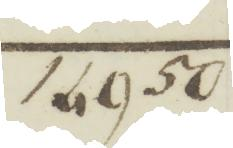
14950
